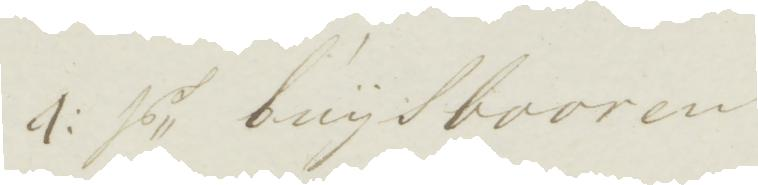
4: p„s buijsbooren
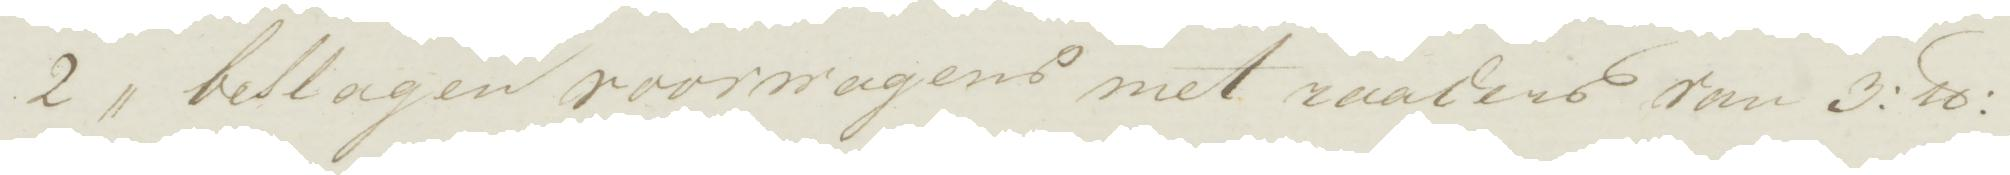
2 „ beslagen voorwagens met raaders van 3: lb:
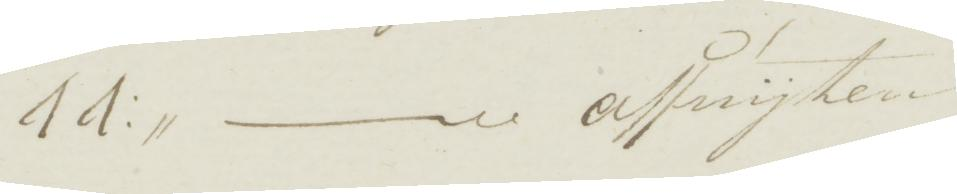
44: „ _o affuijten
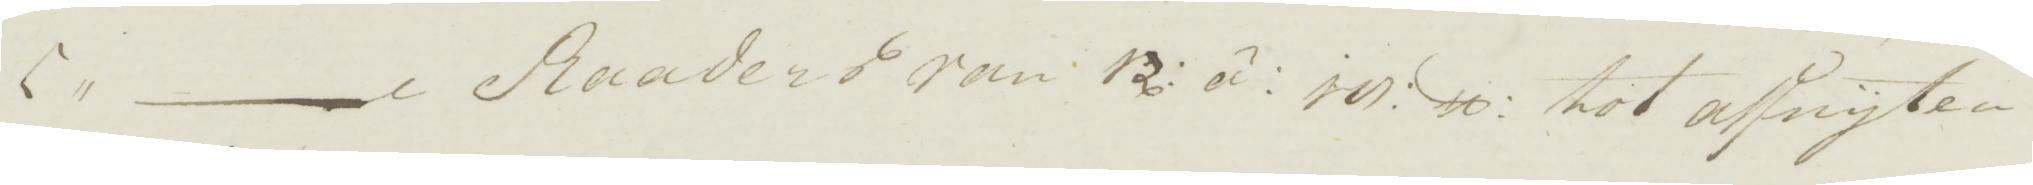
5 „ _o Raaders van 12: â: 18: lb: tot affuijten
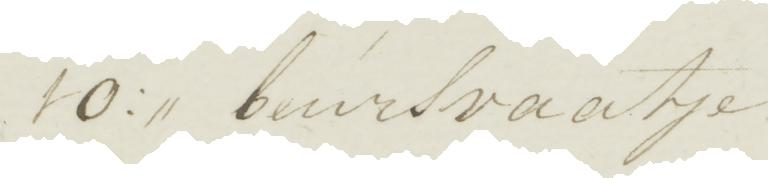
10:„ beursvaatje.
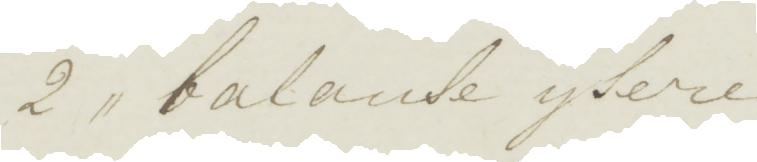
2 „ balause ijsere
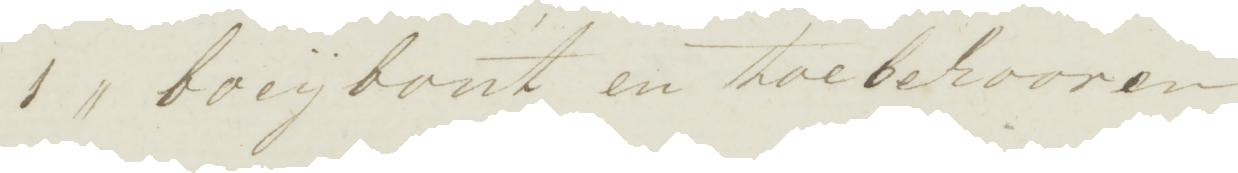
1 „ boeijbout en toebehooren
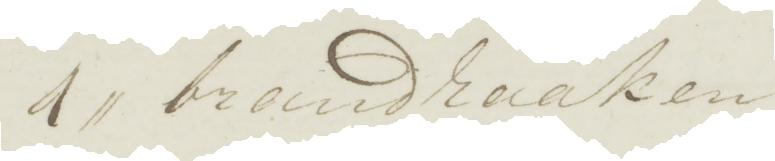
4 „ brandhaaken
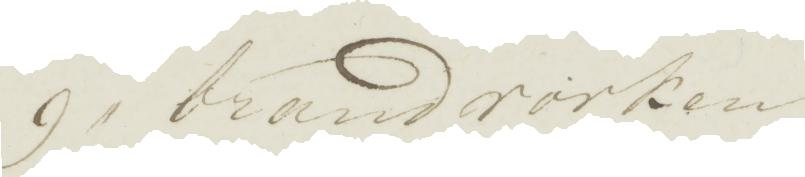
9 „ brand vorken
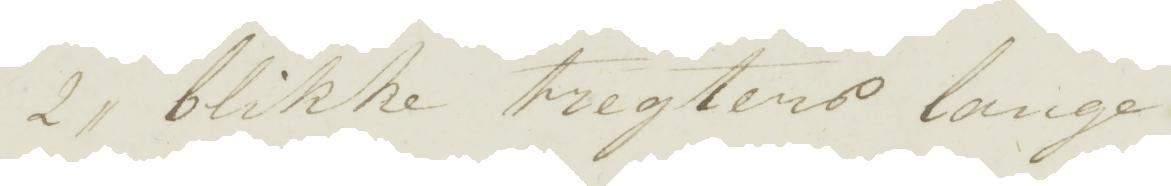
2 „ blikke tregters lange
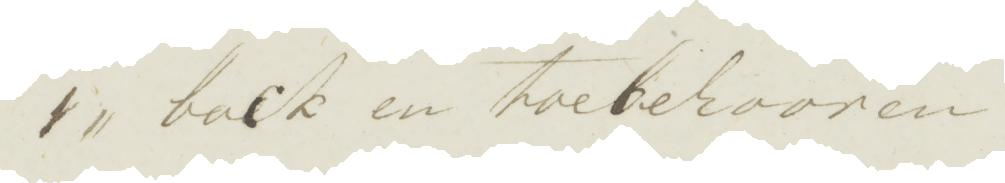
1 „ balk en toebehooren
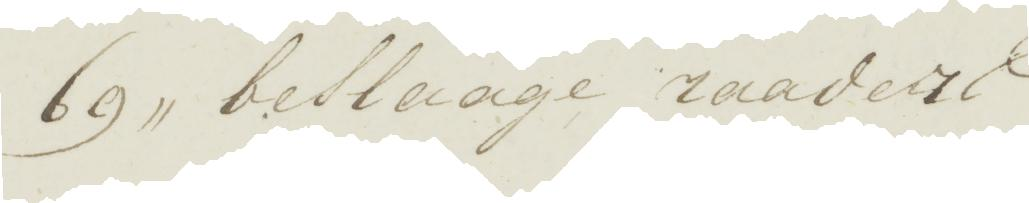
69 „ beslaage raaders
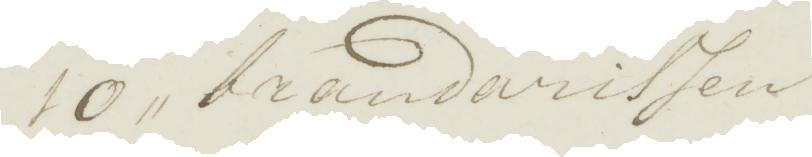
10 „ brandarissen
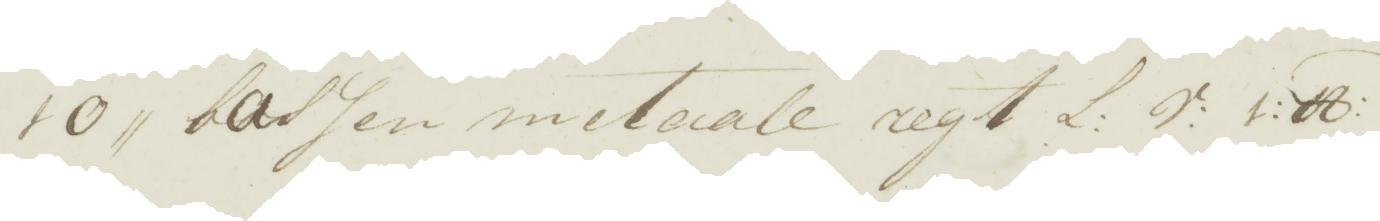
10 „ bassen metaale regt L: v: 1: lb:
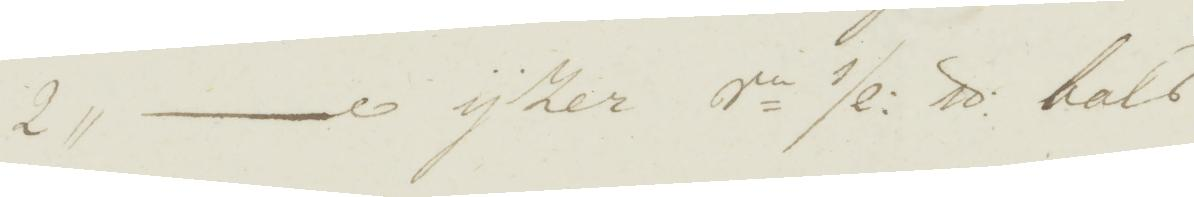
2„ _o ijzer v=n ½: lb: bals
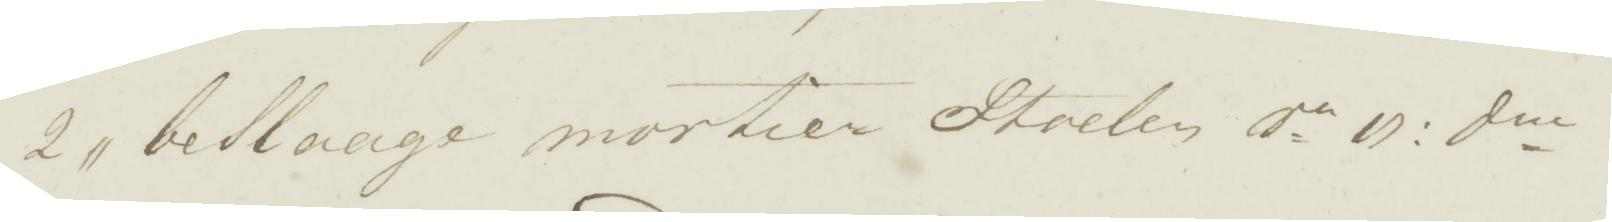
2 „ beslaage mortier stoelen v=n 8: d=m
